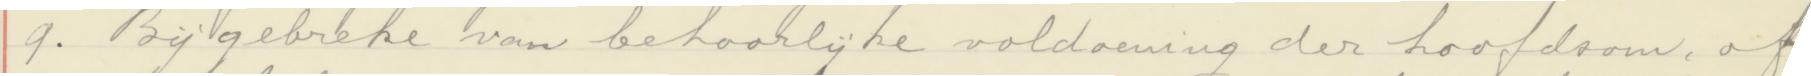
9. Bij gebreke van behoorlijke voldoening der hoofdoom, of
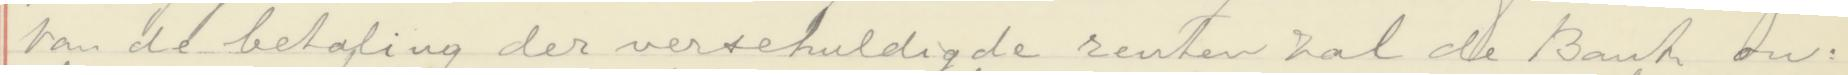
van de betaling der verschuldigde renten zal de Bank on:
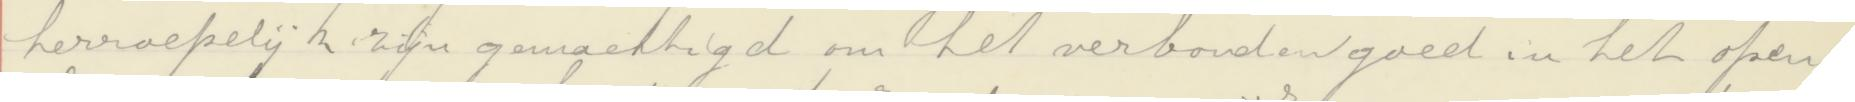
herroepelijk zijn gemachtigd om het verbonden goed in het open
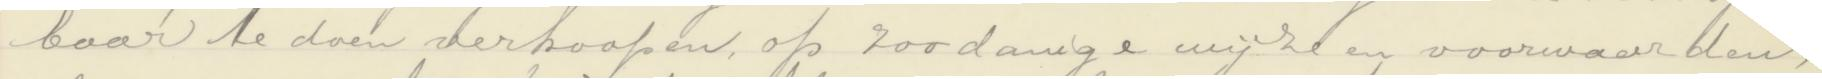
baar te doen verkoopen, op zoodanige wijze en voorwaarden,
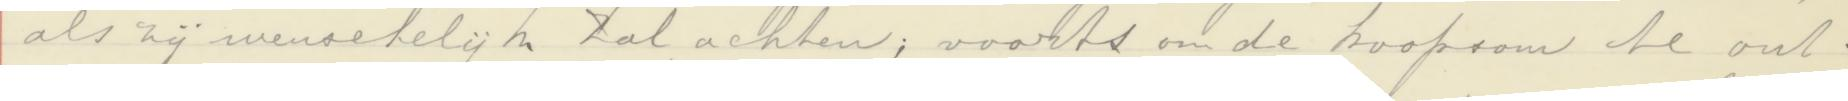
als zij wenschelijk zal achten; voorts om de koopsom te ont
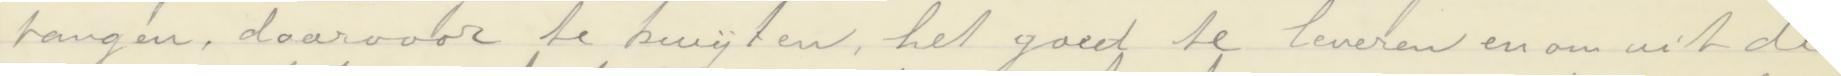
vangen, daarvoor te kwijten, het goed te leveren en om uit de
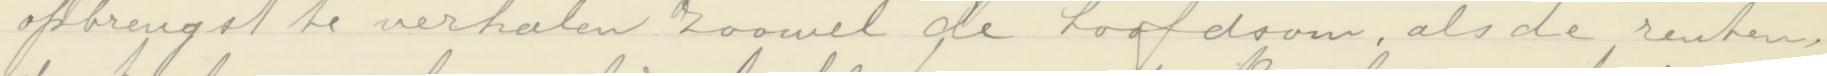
opbrengst te verhalen zoowel de hoofdsom, als de renten,
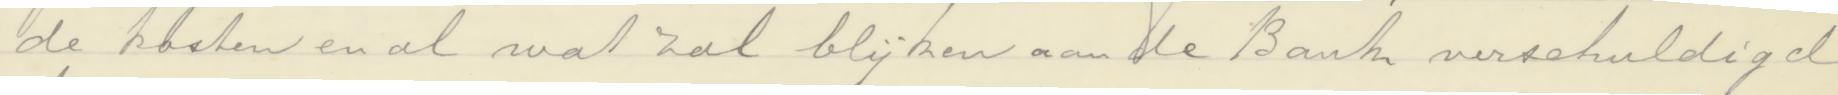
de kosten en al wat zal blijken aan de Bank verschuldigd
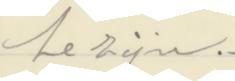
te zijn.
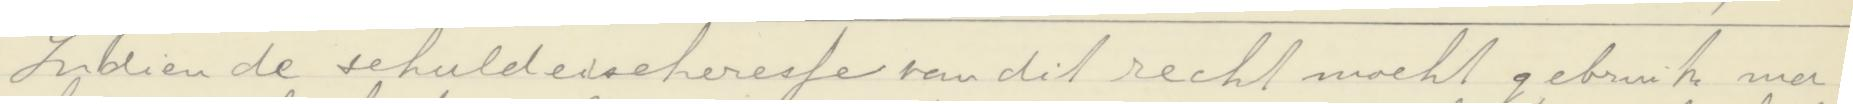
Indien de schuldeischeresse van dit recht mocht gebruik ma
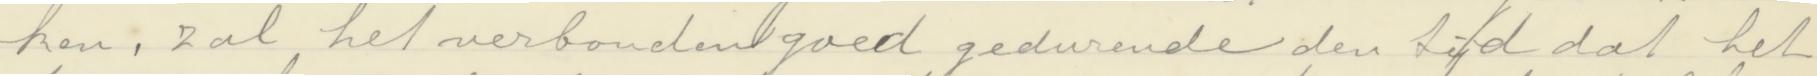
ken, zal het verbonden goed gedurende den tijd dat het
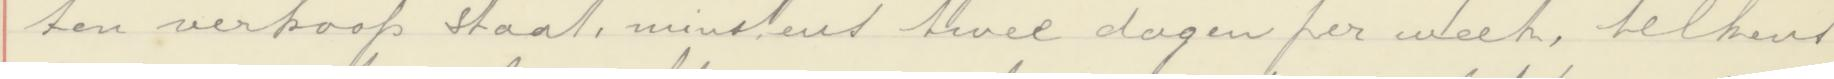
ten verkoop staat, minstens twee dagen per week, telkens
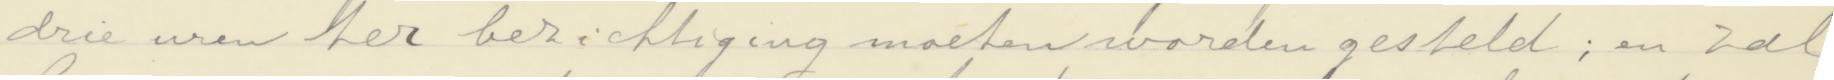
drie uren ter bezichtiging moeten worden gesteld; en zal
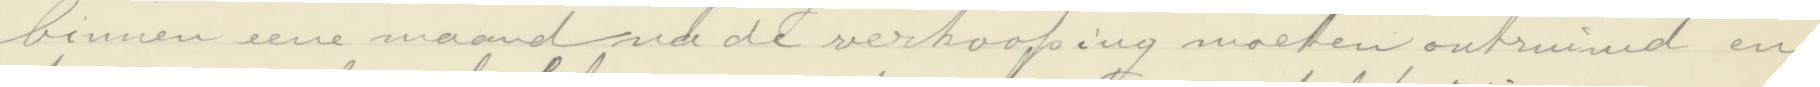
binnen eene maand na de verkooping moeten ontruimd en
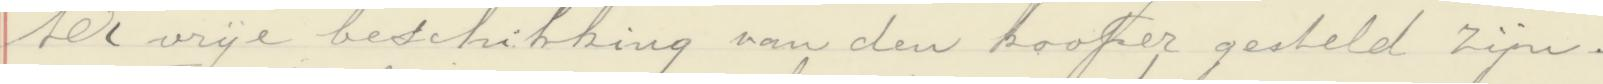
ter vrije beschikking van den kooper gesteld zijn
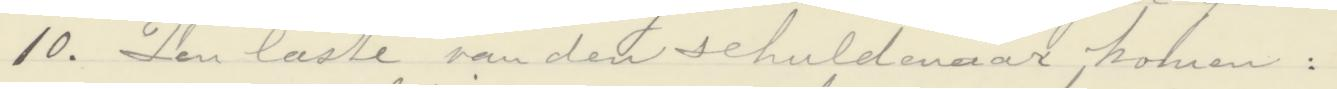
10. Ten laste van den schuldenaar komen:
